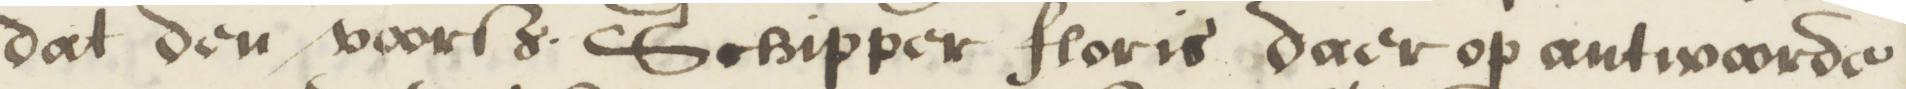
dat den voorsz. schipper floris daer op antwoorde
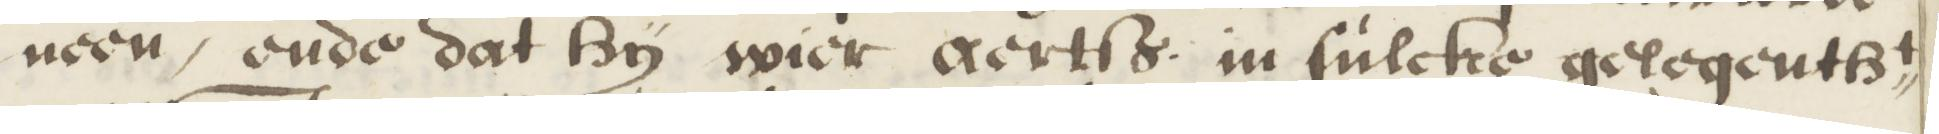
neen, ende dat hij wier aertsz. in sulcke gelegenth„t
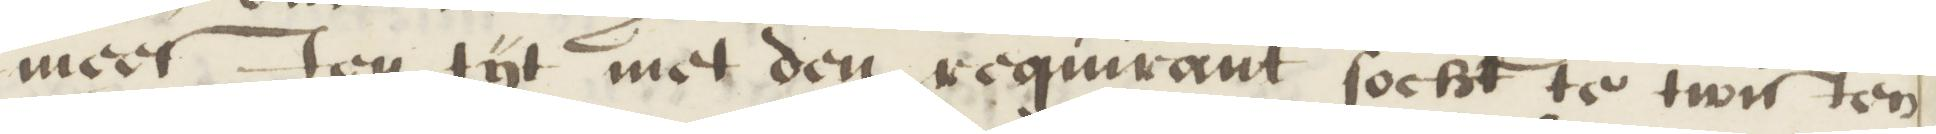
meesten tijt met den requirant socht te twisten
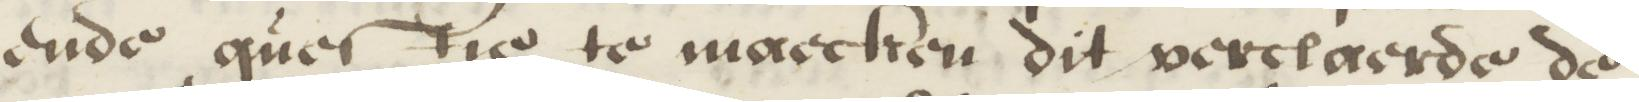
ende questie te maecken dit verclaerde de
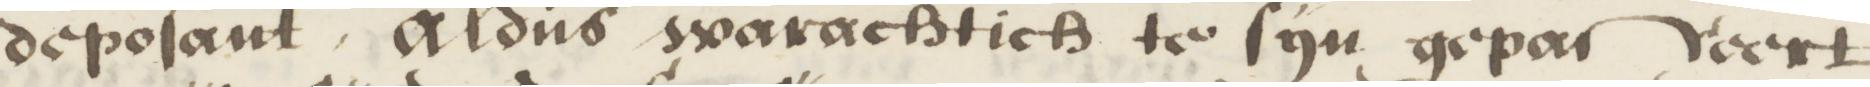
deposant, aldus warachtich te sijn gepasseert
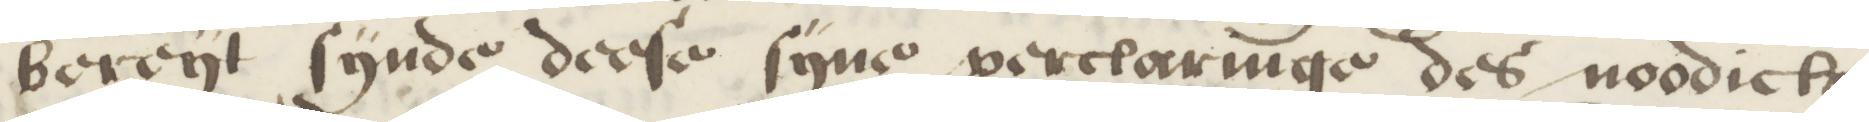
bereijt sijnde deese sijne verclaringe des noodich
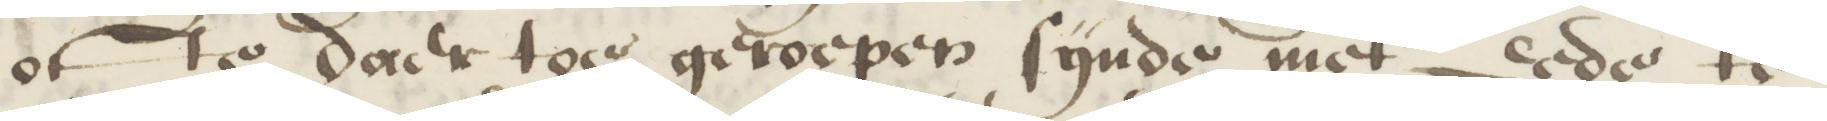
ofte daer toe geroepen sijnde met Eede te
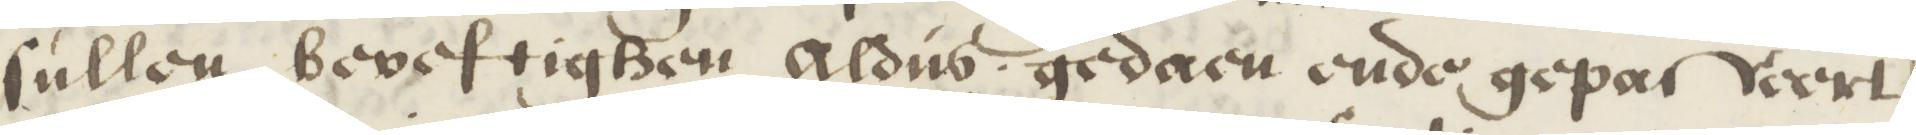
sullen bevestighen alus gedaen ende gepasseert
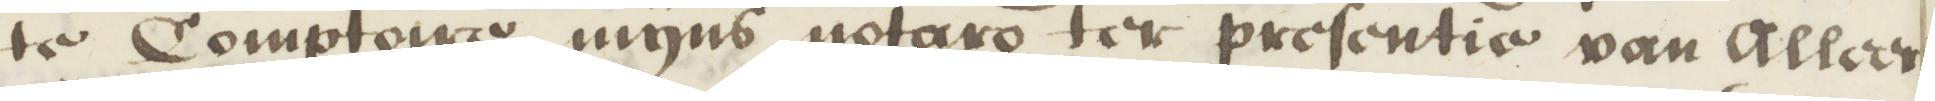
te Comptoire mijns notaro ter presentie van alleer
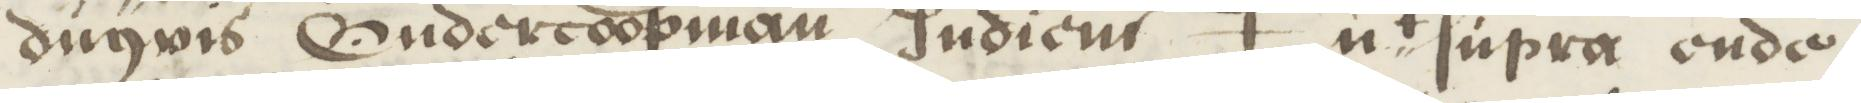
duijvis Ondercoopman Indienst u.„t supra onde
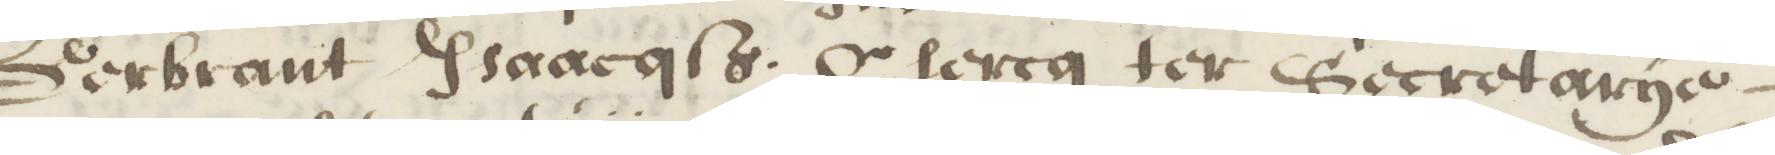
Gerbrant Jsaacqsz. Clercq ter Secretarije
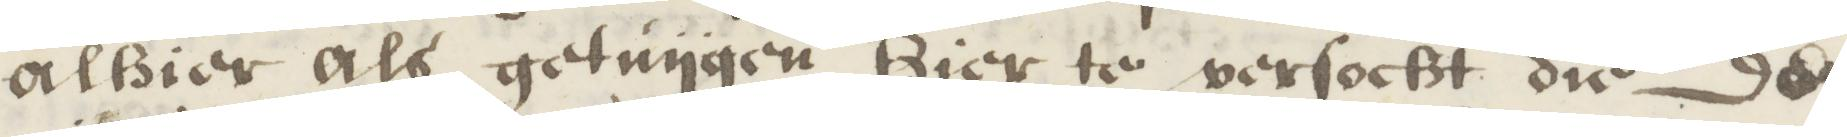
alhier als getuijgen hier te versocht dis de
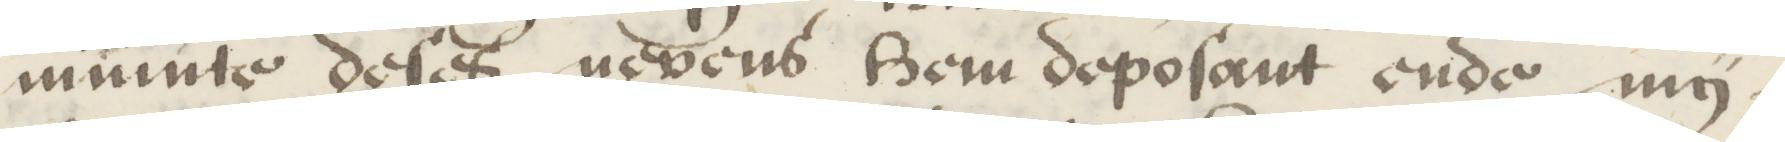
minute deses nevens hem deposant ende mij
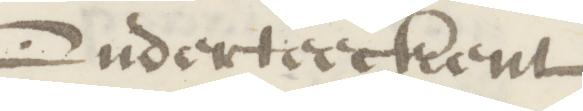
Onderteeckent
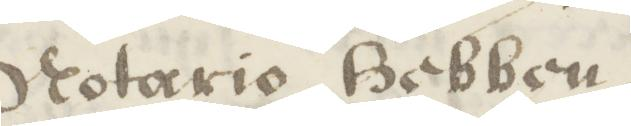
Notaris hebben
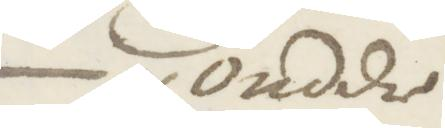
„onder
